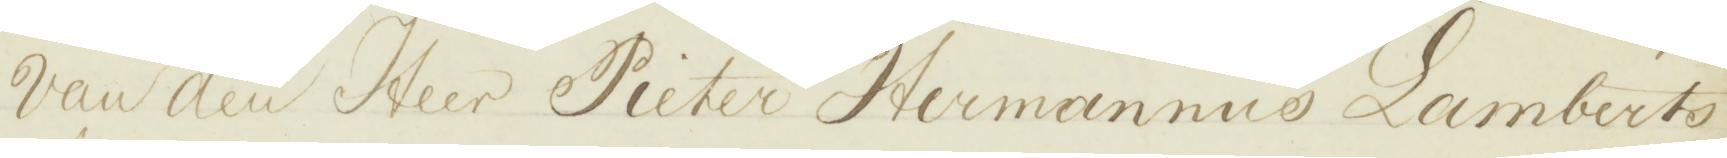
van den Heer Pieter Hermannus Lamberts
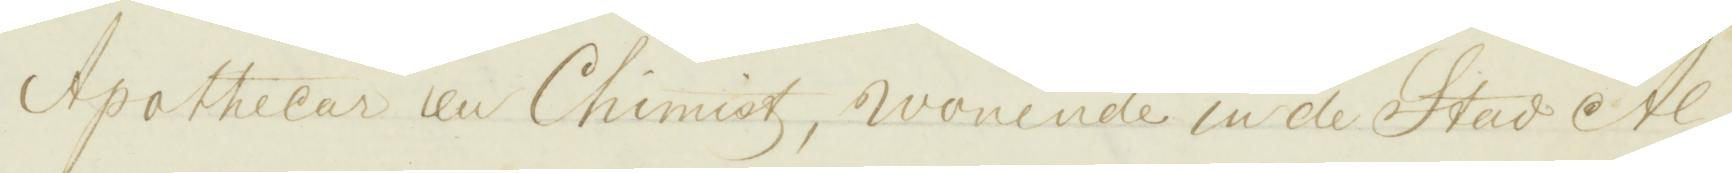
Apothecar en Chimist, wonende in de Stad Al
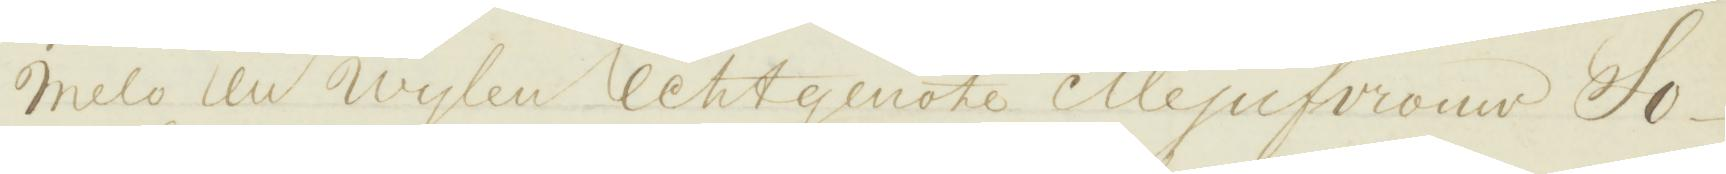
melo en wylen echtgenote Mejufvrouw So-
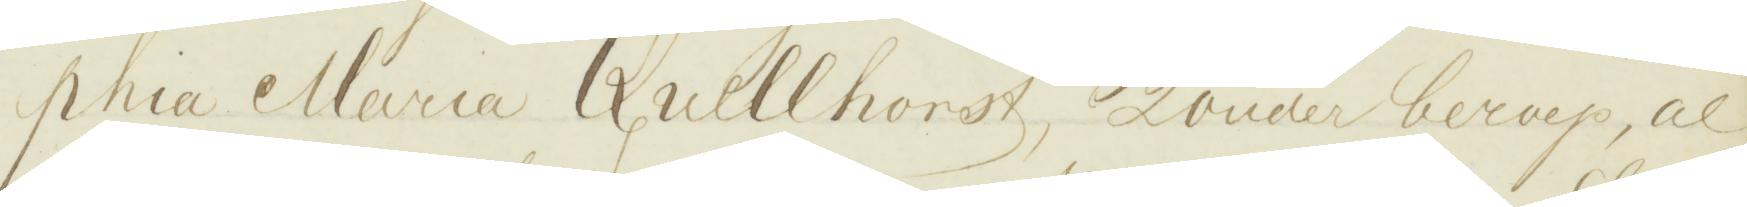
phia Maria Quellhorst, zouder beroep, al
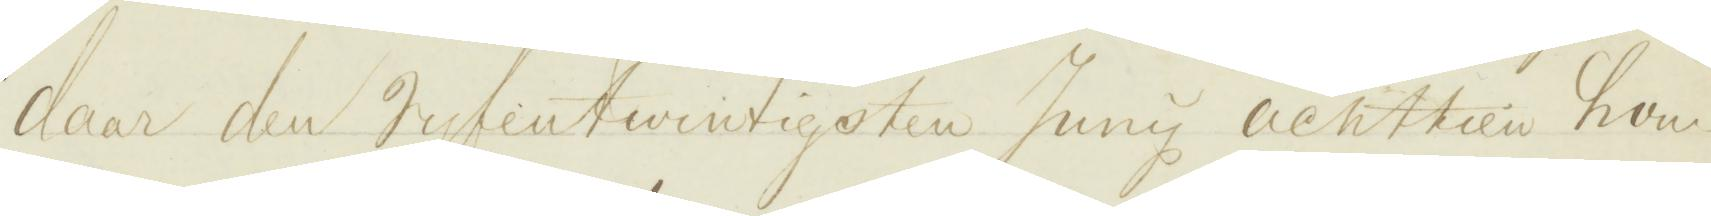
daar den Vyfentwintigsten Junij achttien hou
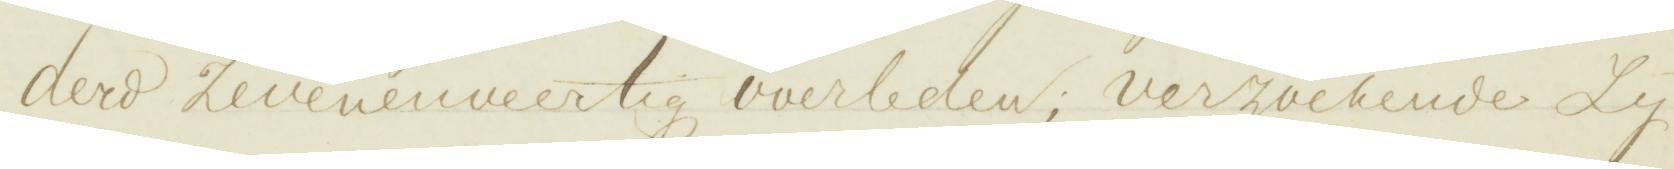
derd zevenenveertig overleden; verzoekende Zy
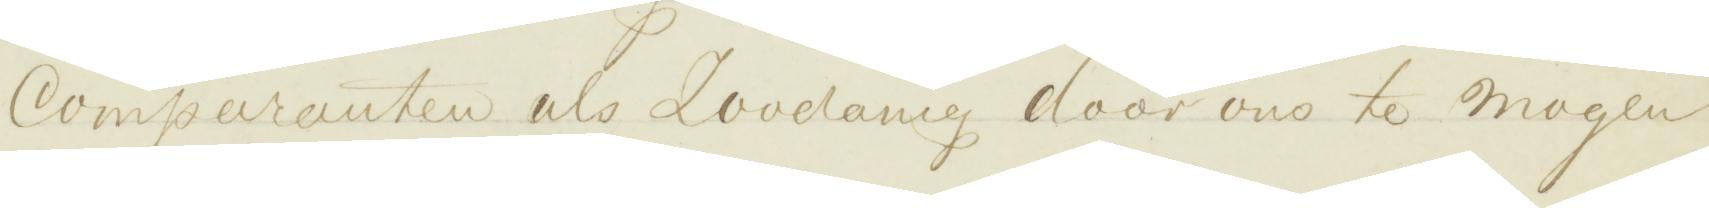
Comparanten als Zoodanig door ons te mogen
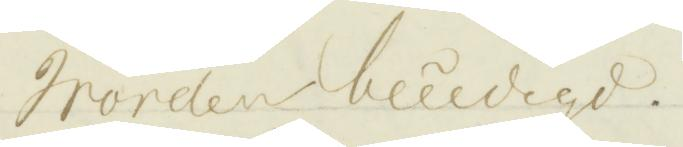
worden beëedigd.
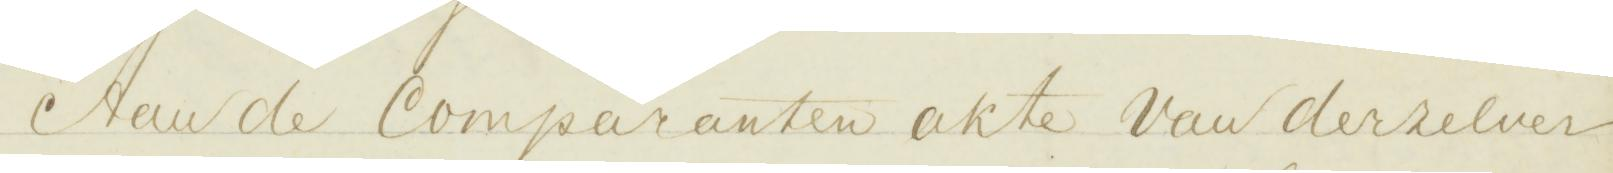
Aan de Comparanten akte van derzelver
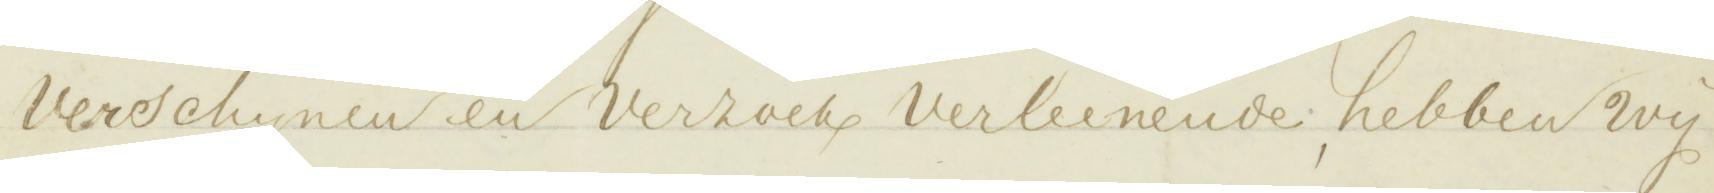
verschynen en verzoek verleenende hebben wij
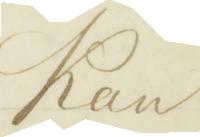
Kan
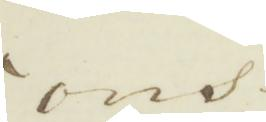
¶ ons.
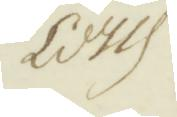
LVHS
